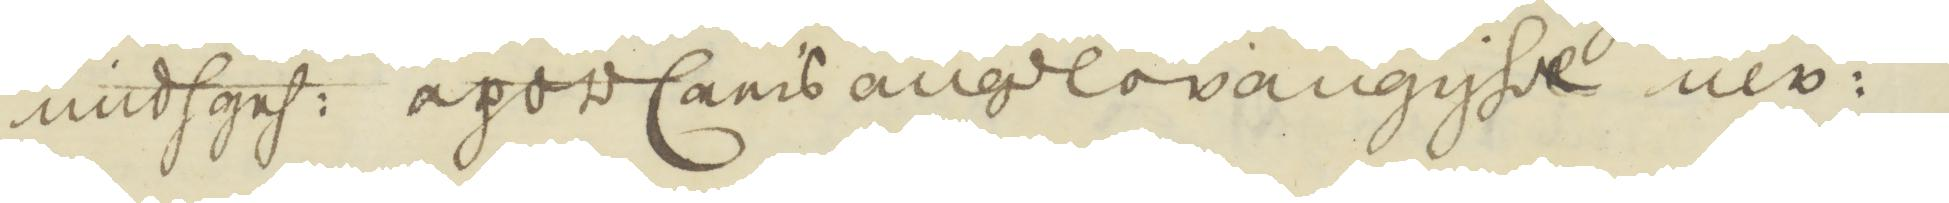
midsgrs: apotecaris angelo van gijsel nev:s
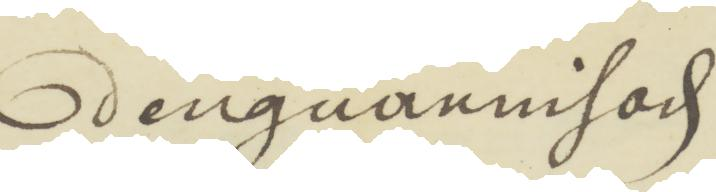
den guarnisoen
